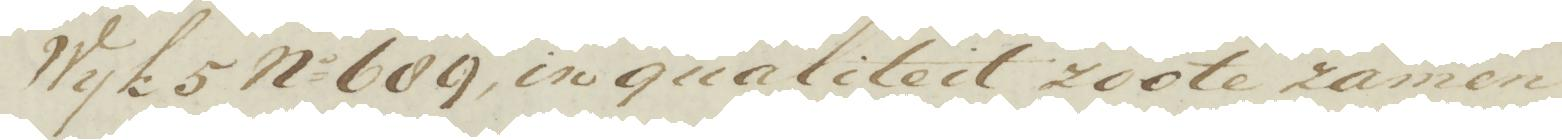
Wijk 5 N=o 689, in qualiteit zoote zamen
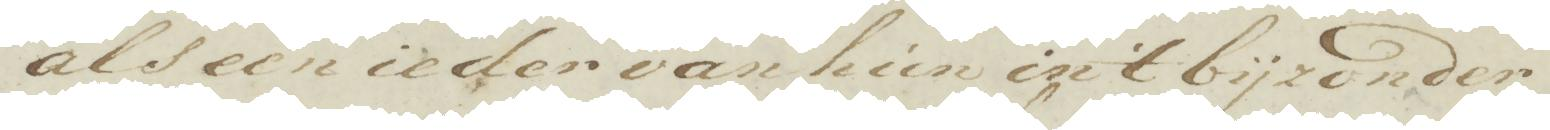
als een ieder van hun in ’t bijzonder
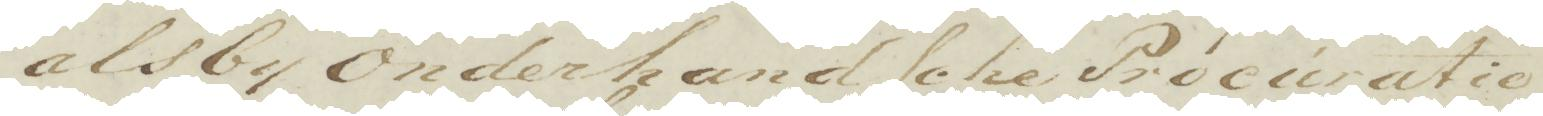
als bij onderhandsche Procuratie
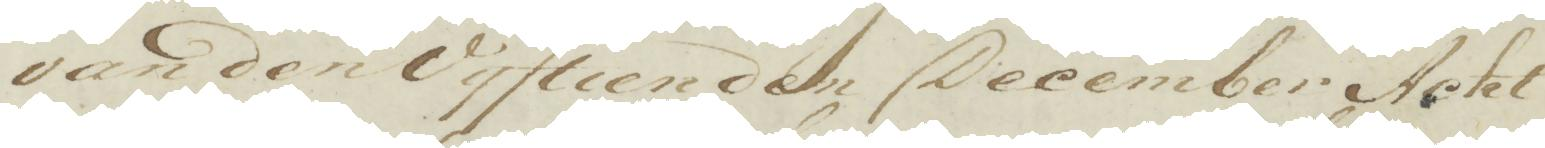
van den Vijftienden December Acht
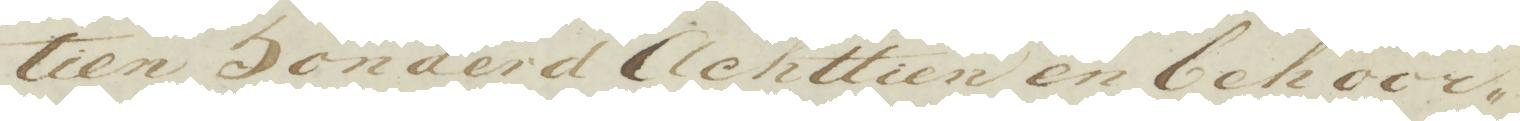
tien Honderd Achttien en behoor„
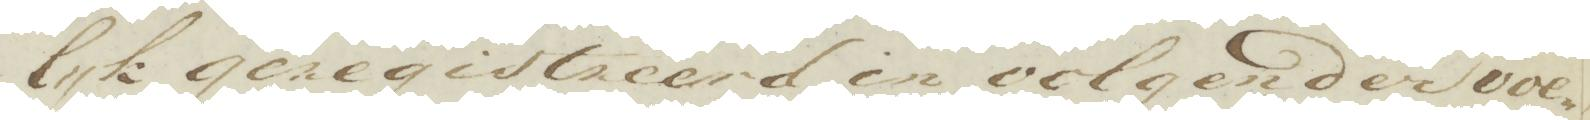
lijk geregistreerd en volgender voe„
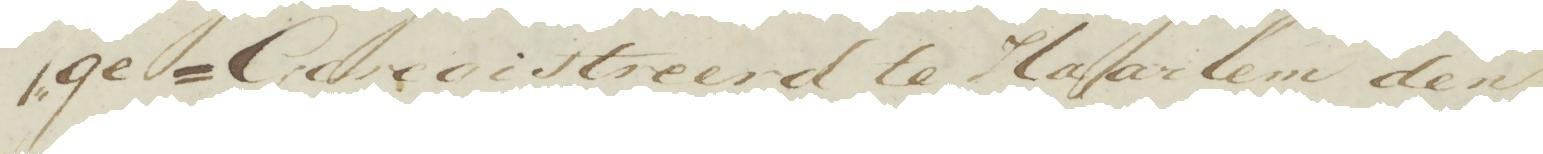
ge = Geregistreerd te Haarlem den
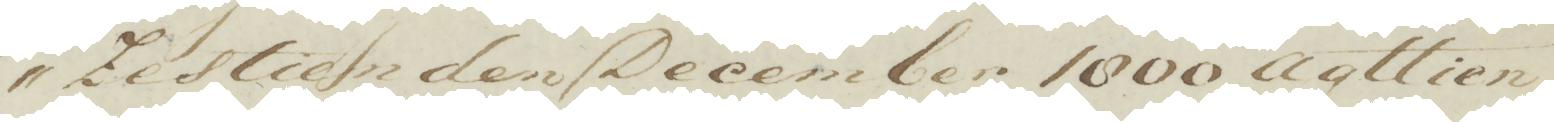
„ Zestien den December 1800 agttien
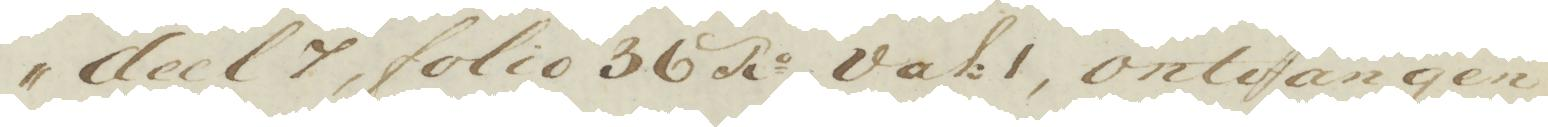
„ deel 7, folio 36 R=o, Vak 1, ontvangen
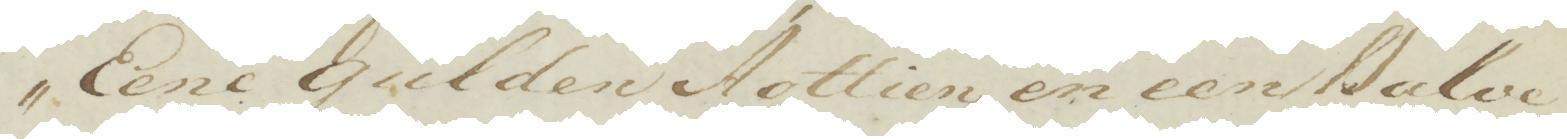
„ Eene gulden Agttien en een halve
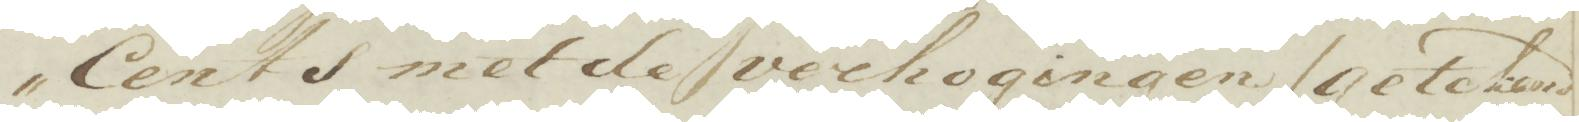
„ Cents met de verhogingen /getekend
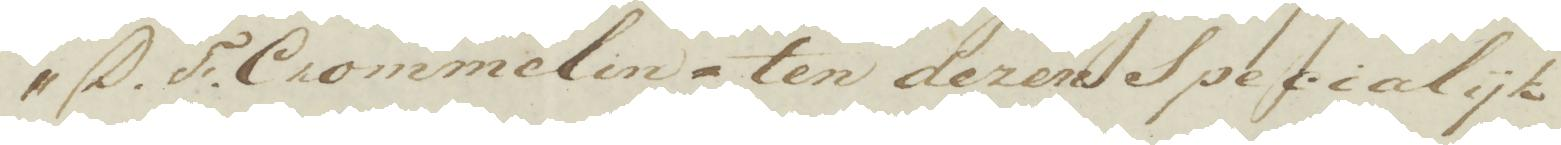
„ D. F. Crommelin = ten dezen specialijk
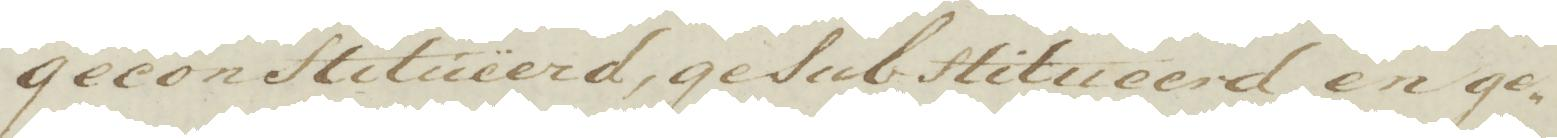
geconstituëerd, gesubstitueerd en ge„
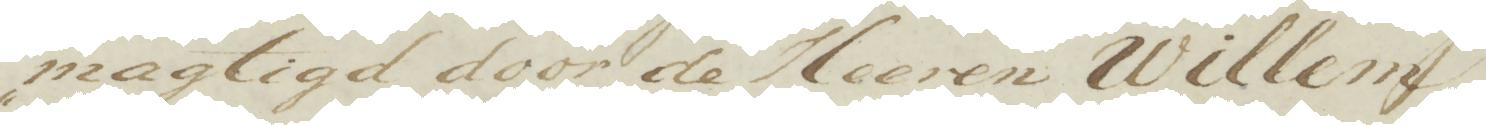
magtigd door de Heeren Willem
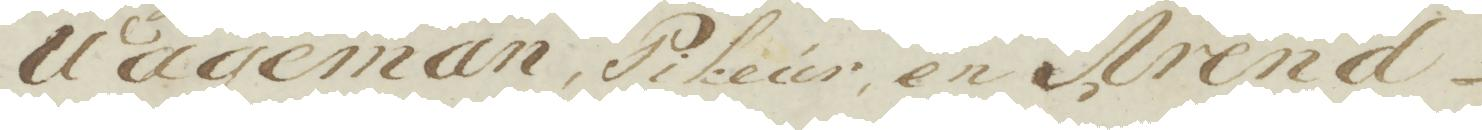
Wageman, Pikeur, en Arend -
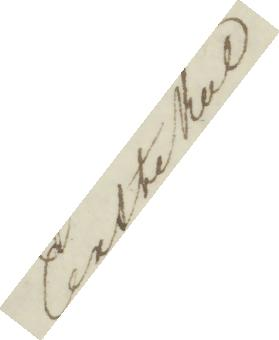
Eerste Keer
